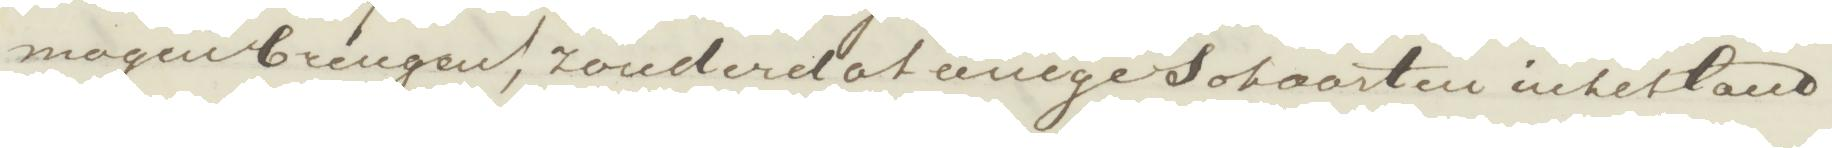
mogen brengen, zonder dat eenige schoorten in het land
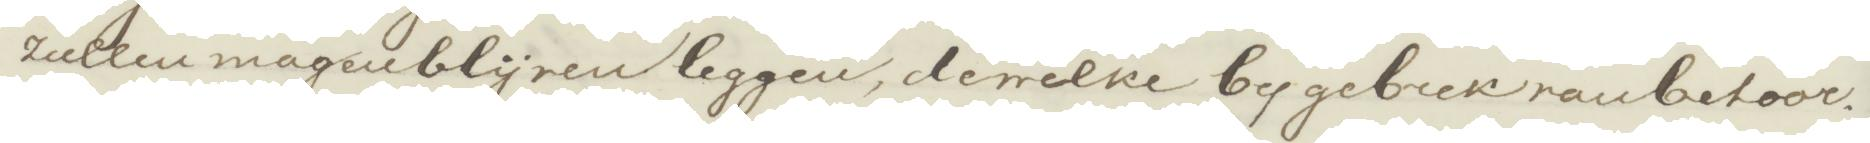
zullen mogen blijven leggen, dewelke by gebrek van behoor.
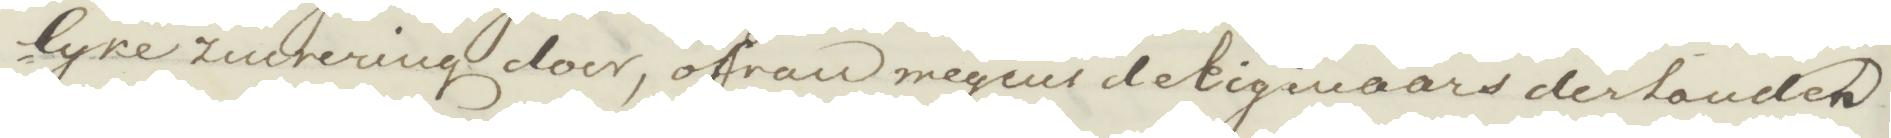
=lyke zuivering door, of van wegens de Eigenaars der landen
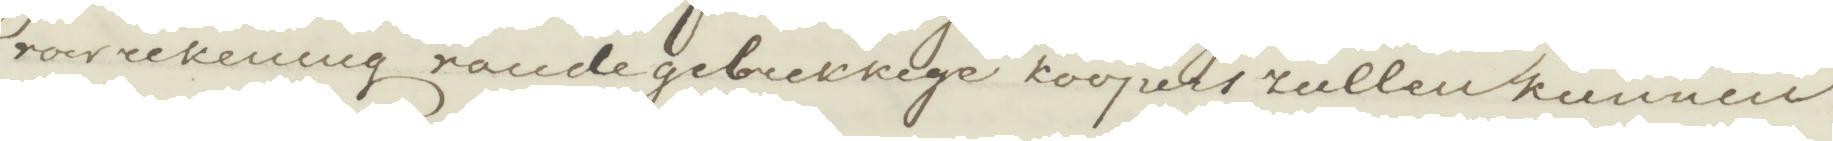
voor rekening vande gebrekkige koopers zullen kunnen
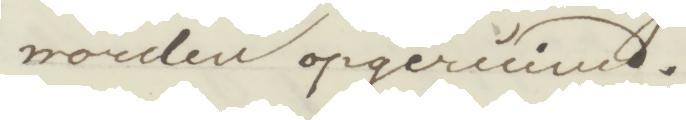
worden opgeruimd.
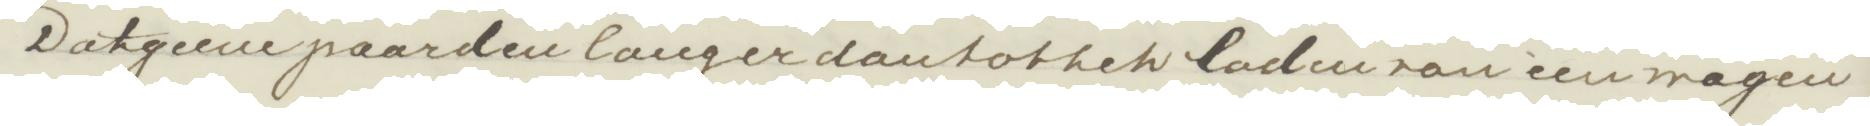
Dat geene paarden langer dan tot het laden van een wagen
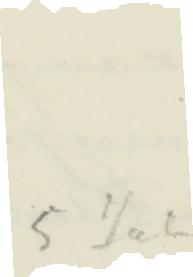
5 Iul
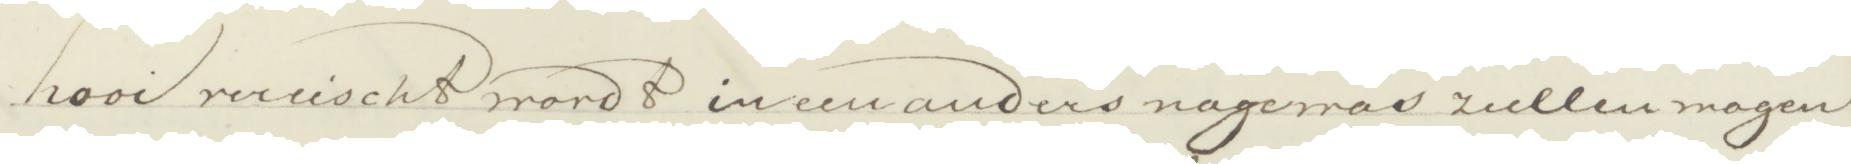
hooi vereischt wordt in een anders nagewas zullen mogen
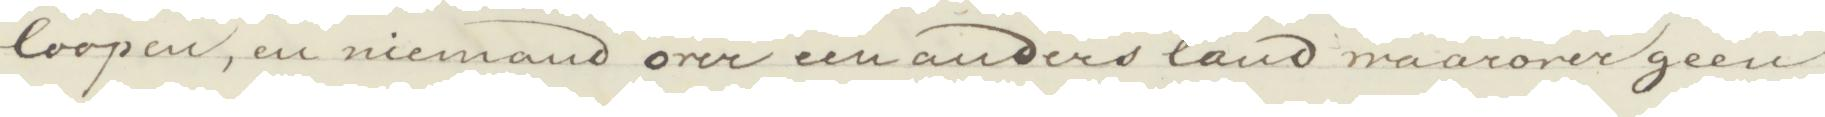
loopen, en niemand over een anders land waarover geen
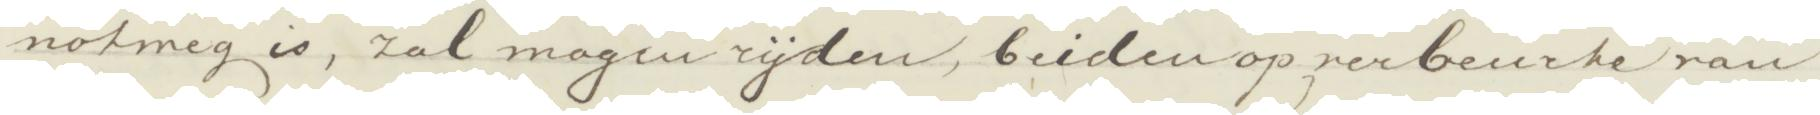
notweg is, zal mogen rijden, beiden op verbeurte van
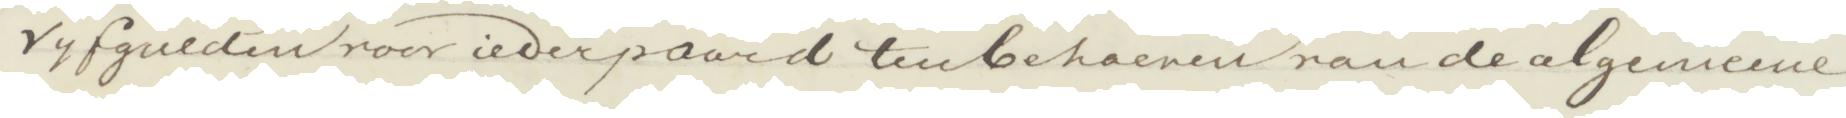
Vyfgulden voor ieder paard ten behoeven van de algemeene
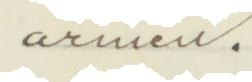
armen.
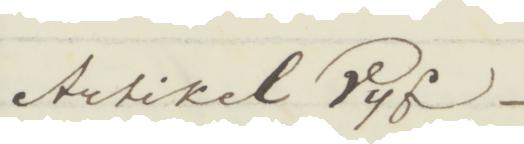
Artikel Vyf
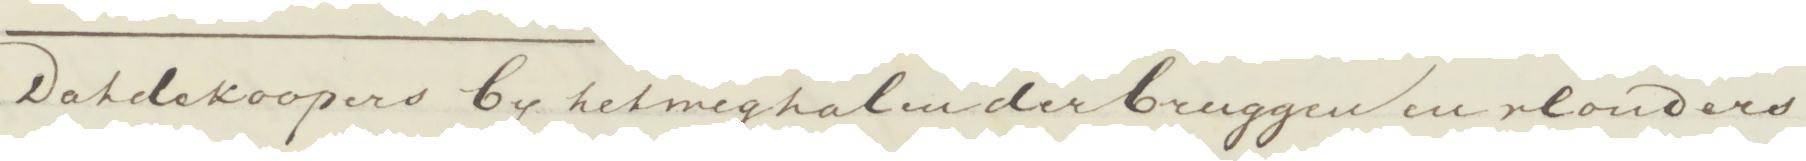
Dat de koopers by het weghalen der bruggen en vlonders
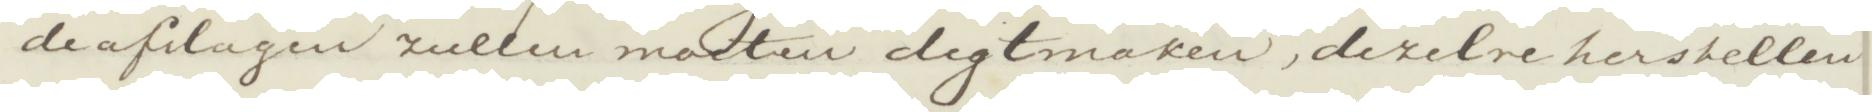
de afslagen zullen moeten digtmaken, dezelve herstellen
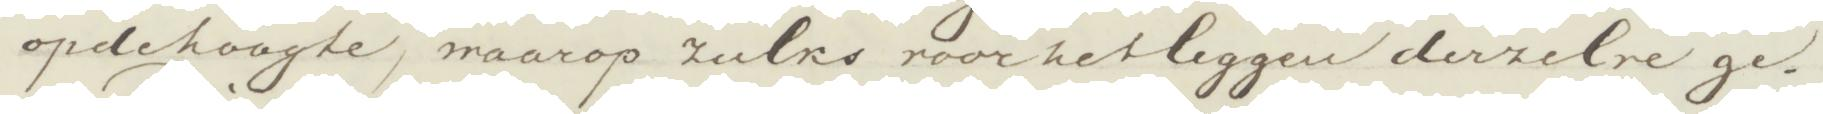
op dehoogte, waarop zulks voor het leggen derzelve ge-
